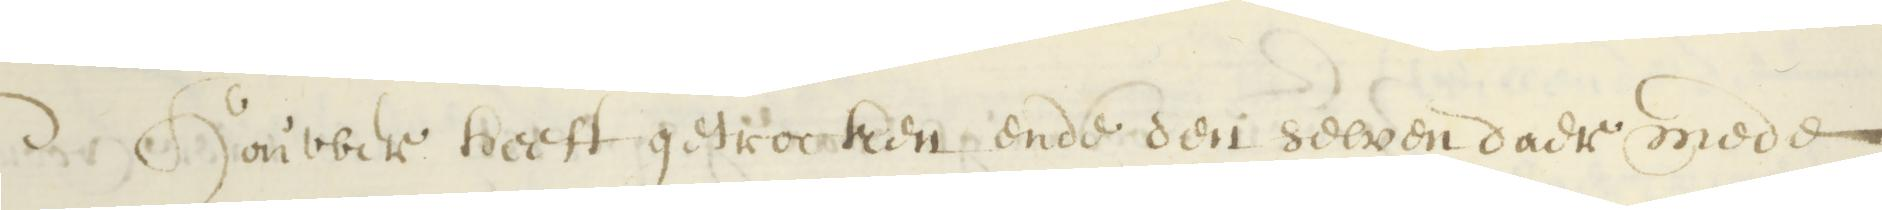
Houwer heeft getrocken ende den selven daer mede
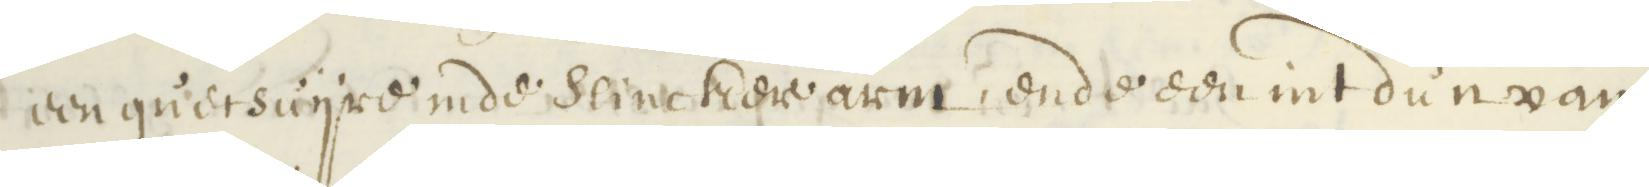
een quetsuijre inde slincker arm, ende een int dun van
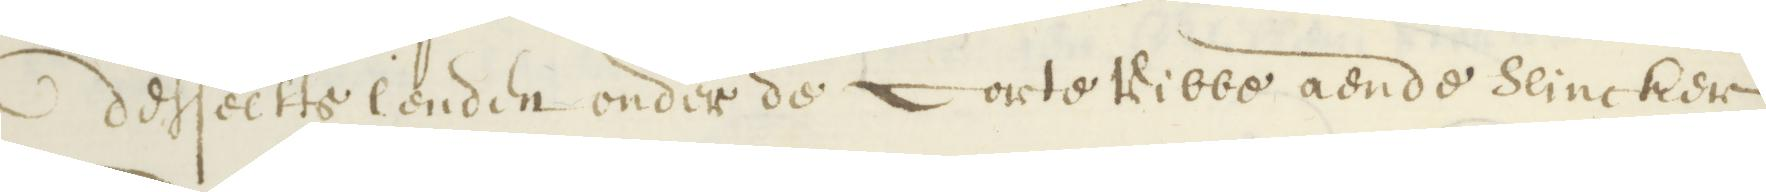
desselffs lenden onder de corte Ribbe aen de slincker
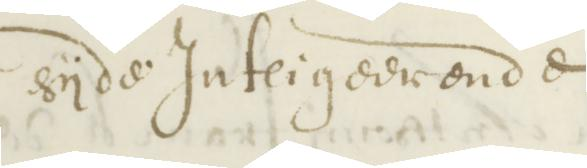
sijde Jntligeerende
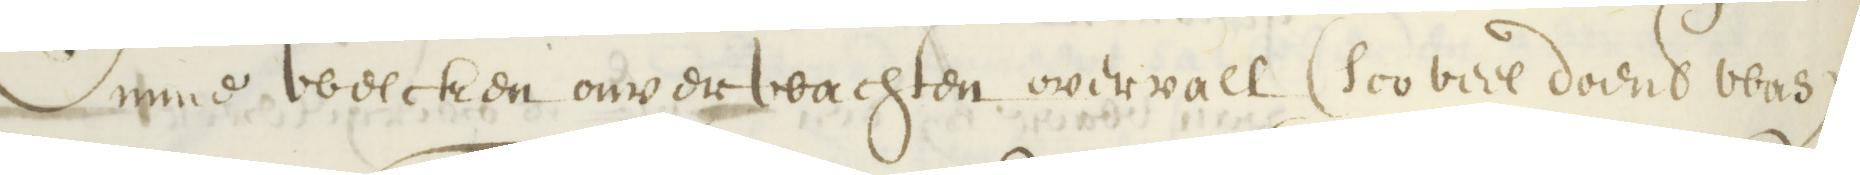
Omme welcken onverwachten overvall (soo veel doenb was)
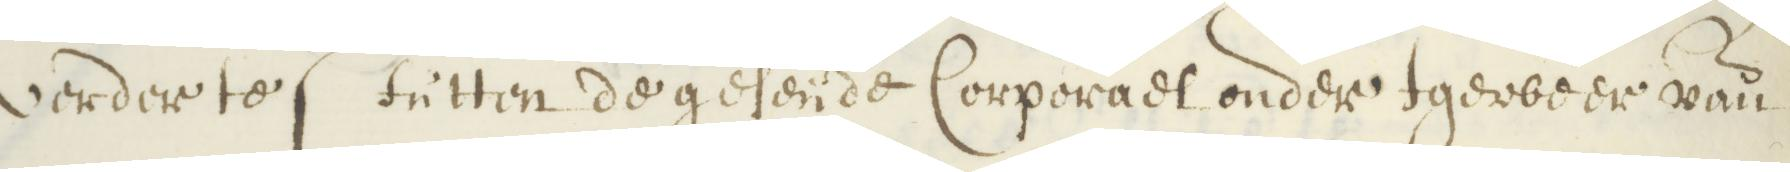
verder te stutten de geseijde Corporael onder tgeweer van
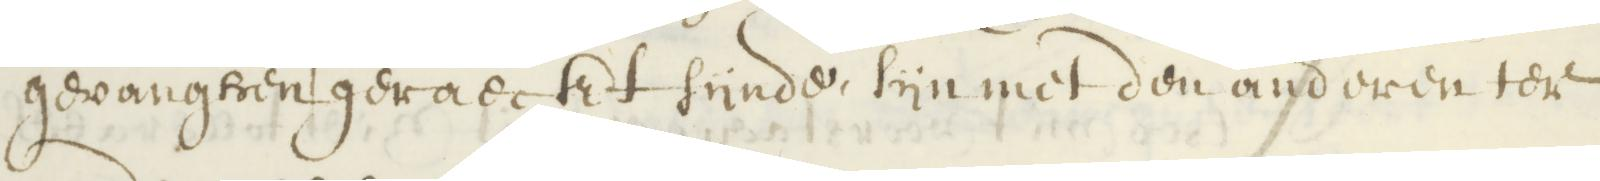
gevanghen geraeckt sijnde, sijn met den anderen ter
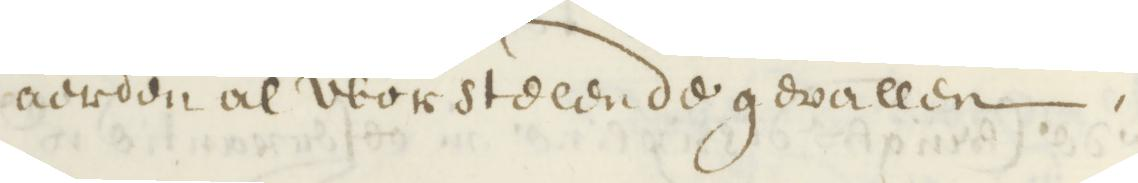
aerden al worstelende gevallen,
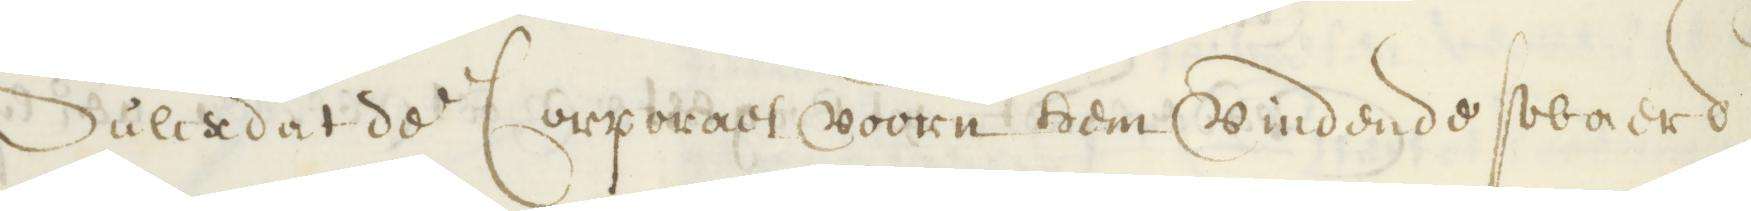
Sulcx dat de Corporael voorn hem vindende swaerd
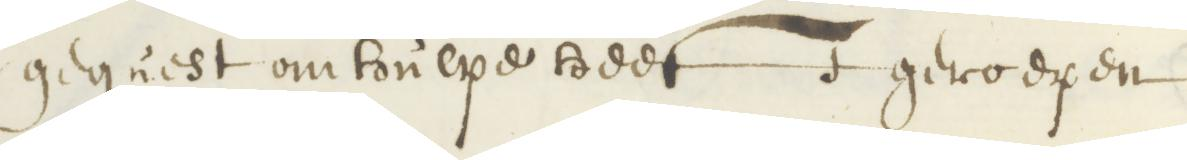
gequest om hulpe heeft geroepen
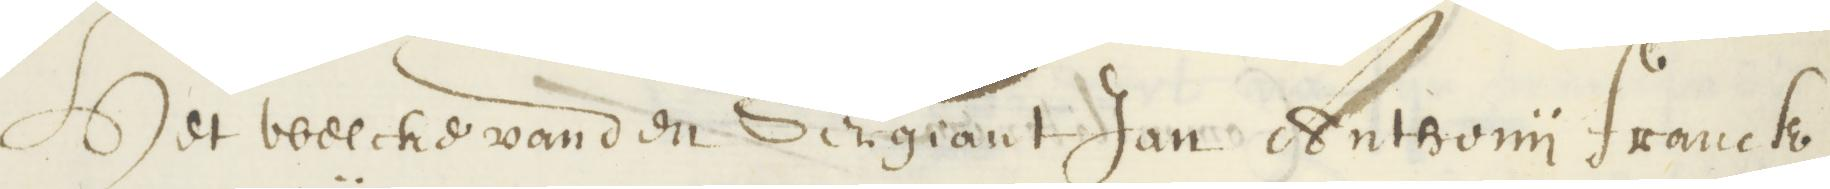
Het welcke van den Sergeant Jan Anthonij franck
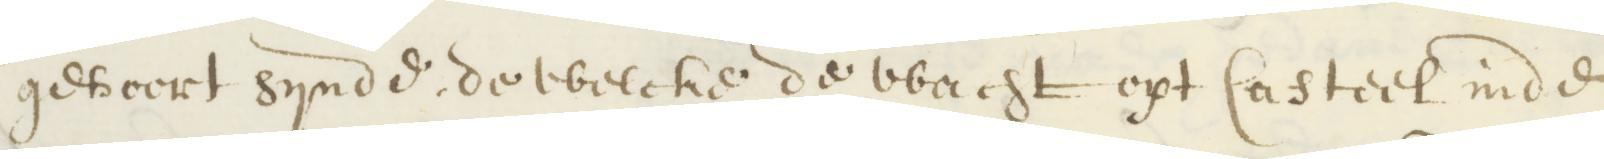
gehoort sjnde, de welcke de wacht opt Casteel inde
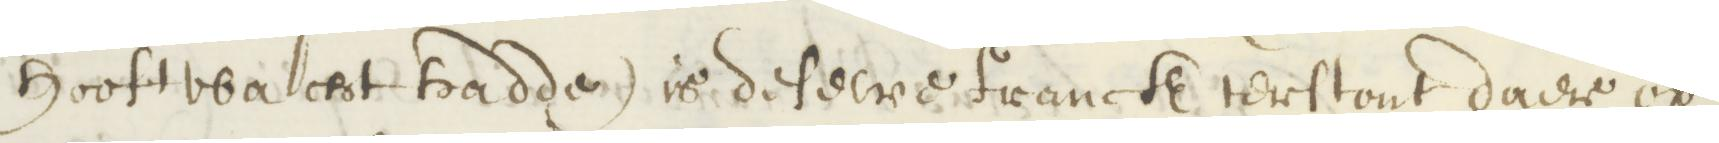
hooftwacht hadde ) is deselve franck terstont daer op
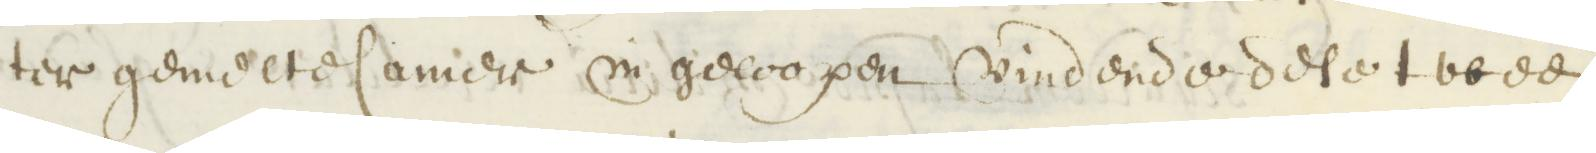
ter gemelte Camer in geloopen vindende dese twee
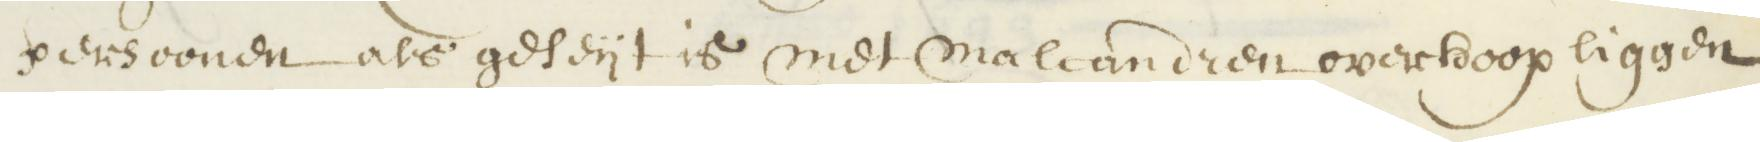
personen als geseijt is met malcanderen overhoop liggen
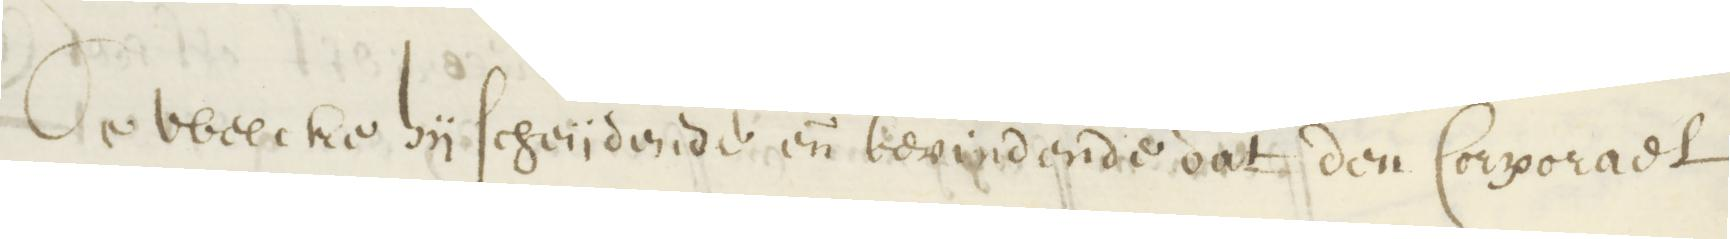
De welcke hij scheijdende, ende bevindende dat den Corporael
